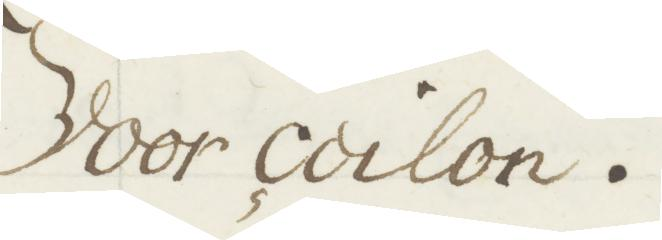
Voor çeilon.
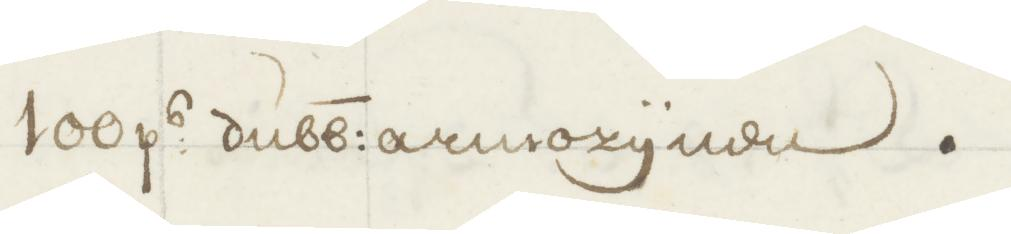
100 p:s dubb: armozijnen.
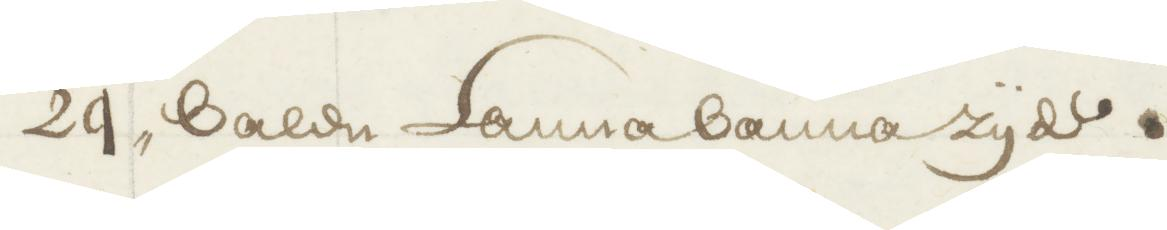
24„ balen Tannabanna zijde.
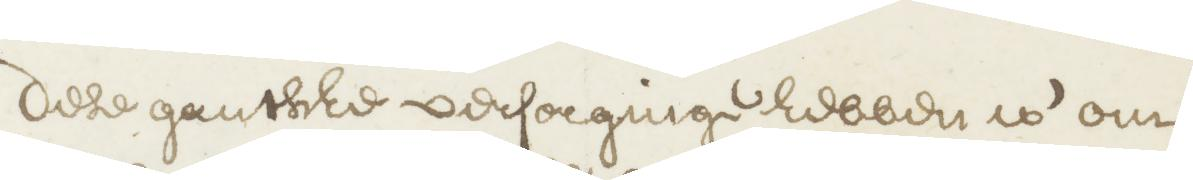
dese gantsche versorginge hebben w' om
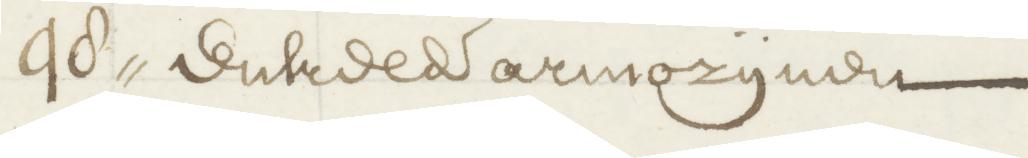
48 „ Enkelde armozijnen
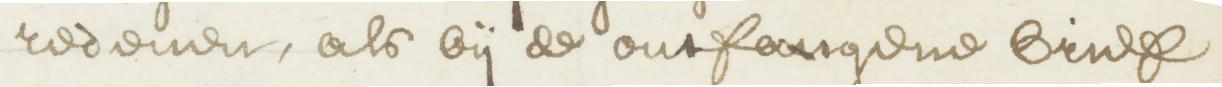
redenen, als bij de ontfangene brief
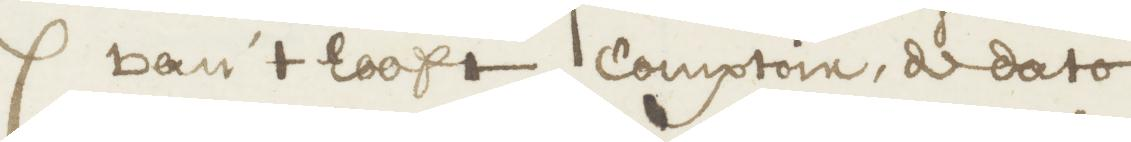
van ’t hooft Comptoir, de dato
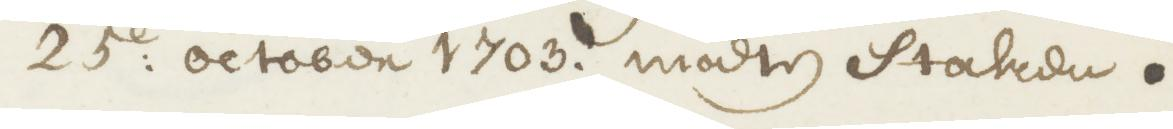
25:e october 1703. moeten staken.
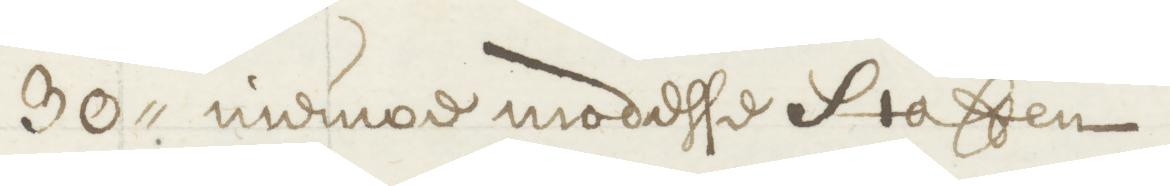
30 „ nieuwe modesse staffen
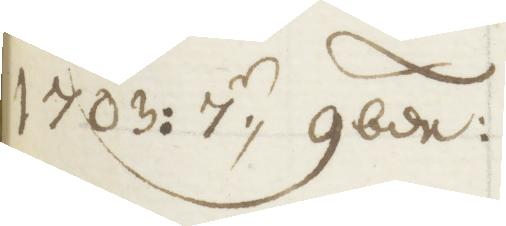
1703: 7„n 9ber:
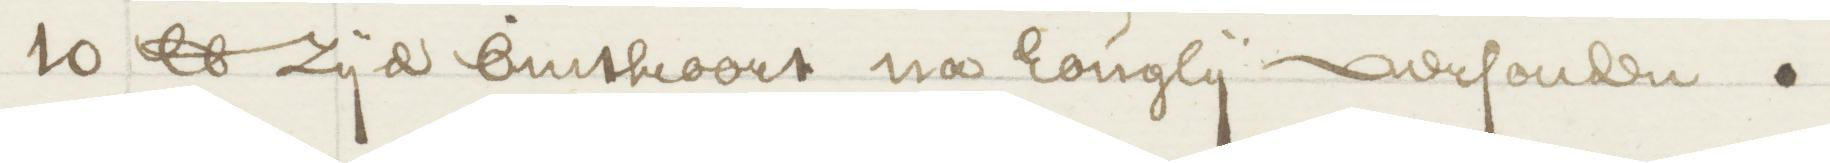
10 lb zijde bintkoort na houglij versonden.
